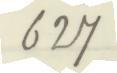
627
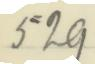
529
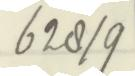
628/9
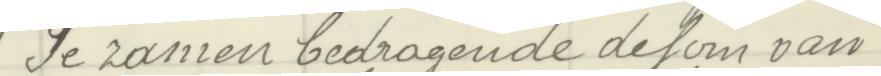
Te zamen bedragende de som van
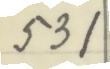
531
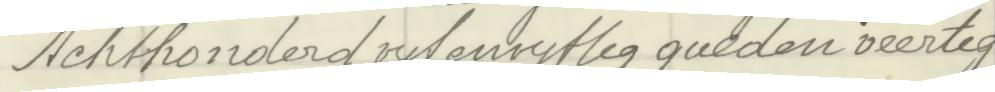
Achthonderd vyf envyftig gulden veertig
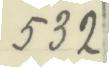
532
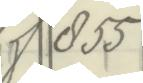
ƒ 855
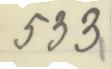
533
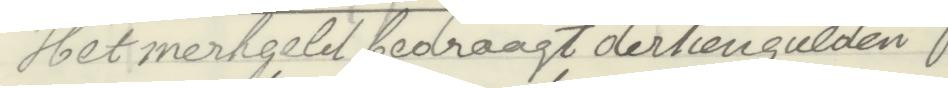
Het mertgeld bedraagt dertien gulden
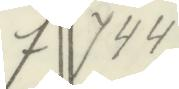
ƒ 744
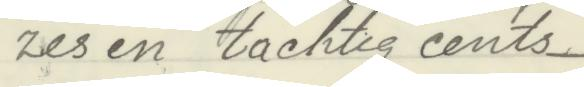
zes en tachtig cents—
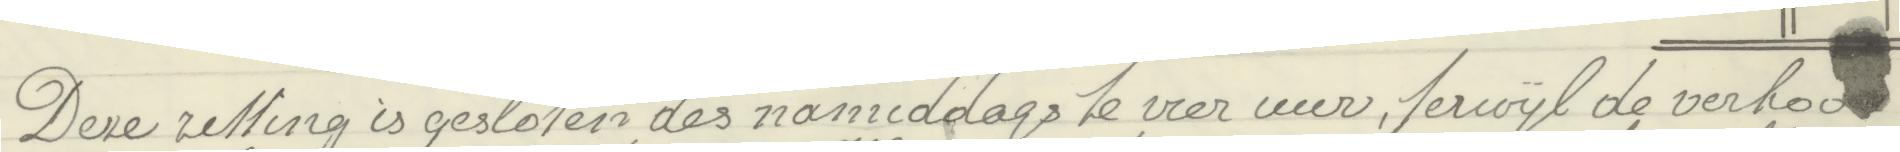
Deze zetting is gesloten des namiddags te vier uur, terwijl de verkoo
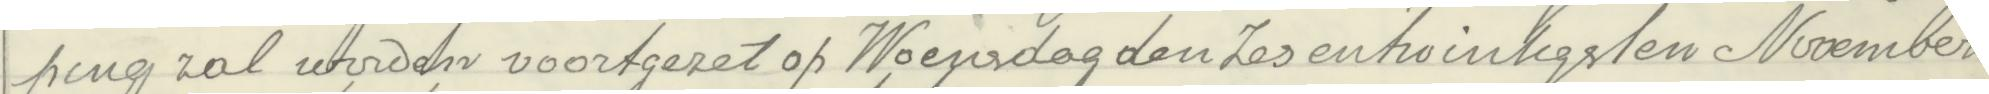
ping zal worden voortgezet op Woensdag den Zes en twintigsten November
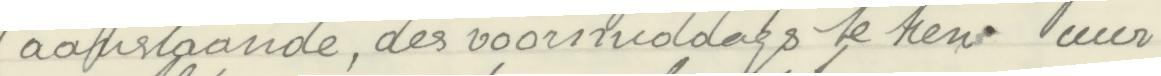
aanstaande, des voormiddage te tien uur
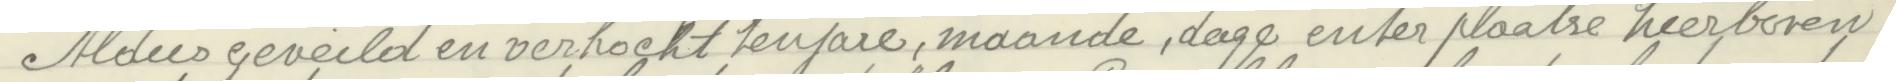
Aldus geveild en verkocht tenjare, maande, dage enter plaatse hierboven
